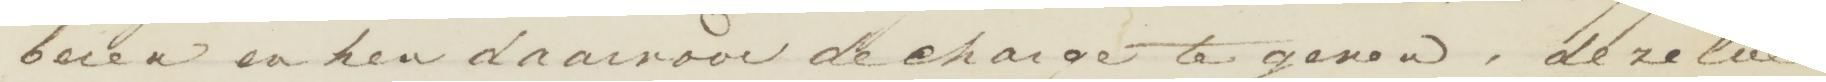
beren en hen daarvoor de charge te geven, dezelve
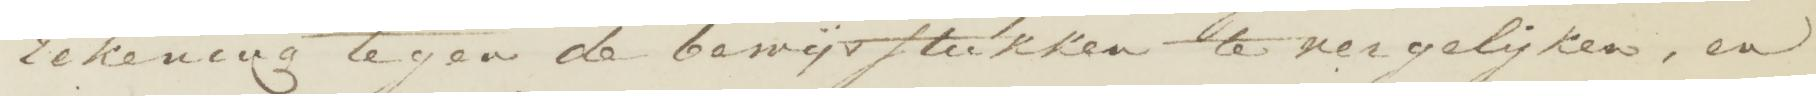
rekening tegen de bewijsstukken te vergelijken, en
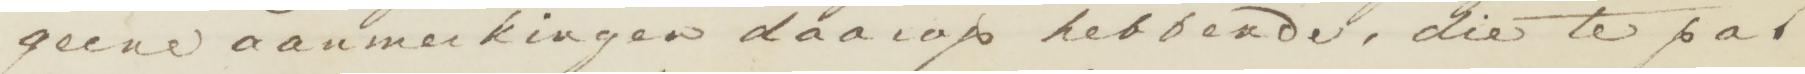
geene aanmerkingen daarop hebbende, die te pas
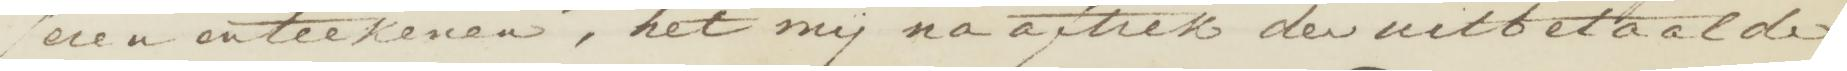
seren enteekenen, het mij na aftrek der uitbetaalde
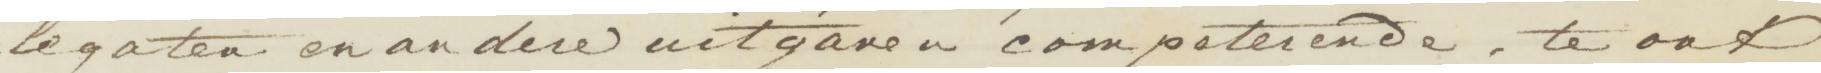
legaten en andere uitgaven competerende, te ont
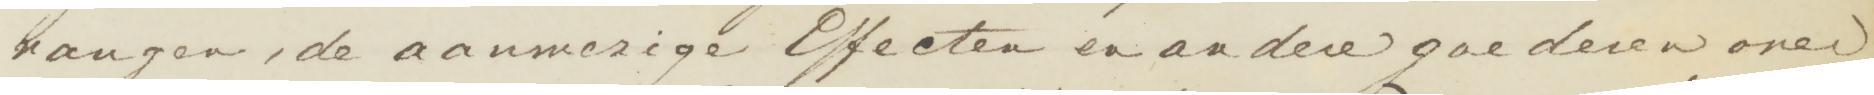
vangen, de aanwezige Effecten en ardere goederen over
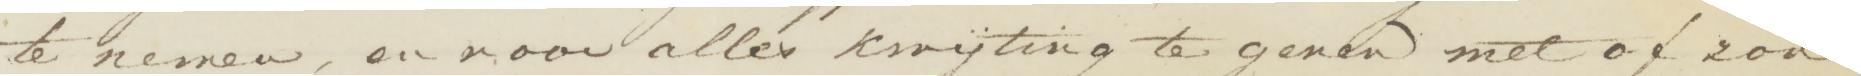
te nemen, en voor alles kwijting te geven met of zon
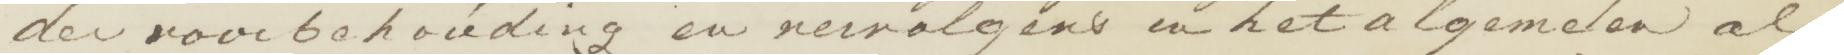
der voorbehouding en vervolgens in het algemeen al
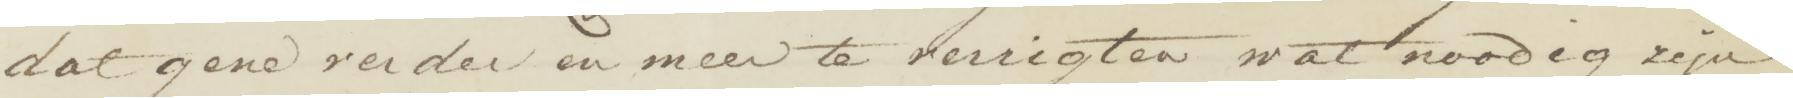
dat gene verder en meer te verrigten wat noodig zijn
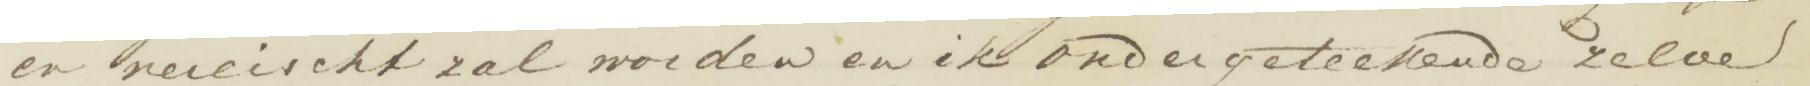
en vereischt zal worden en ik ondergeteekende zelve
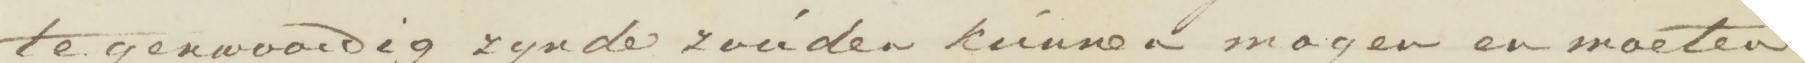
tegenwoordig zynde zouden kunnen mogen en moeten
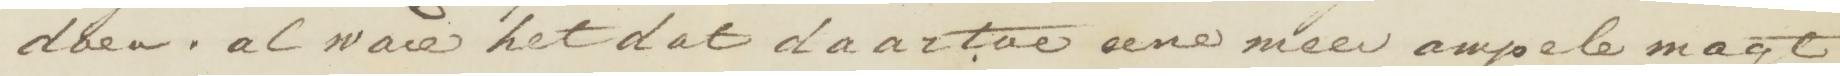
doen, al ware het dat daartoe eene meer ampele magt
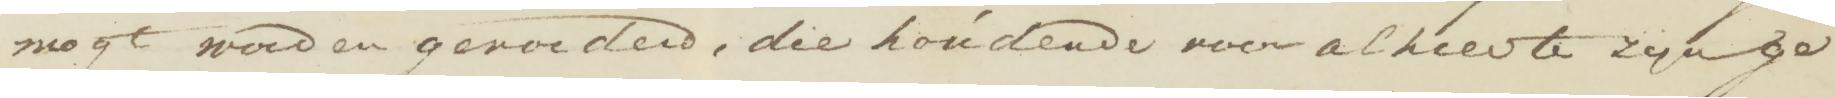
mogt worden gevorderd, die houdende voor alhier te zijn ge
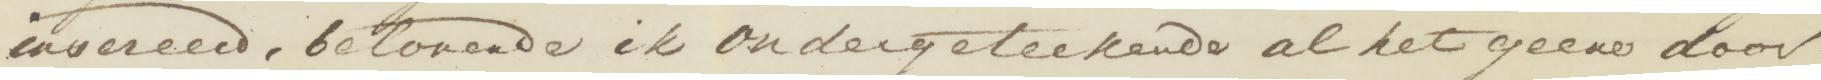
insereerd, belovende ik ondergeteekende al het geene door
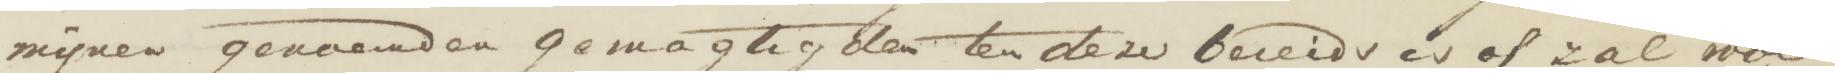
mijnen genoemden gemagtigden ten deze bereids is of zal wor
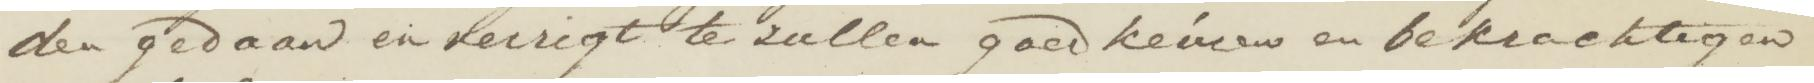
den gedaan en verrigt te zullen goedkeuren en bekrachtigen
